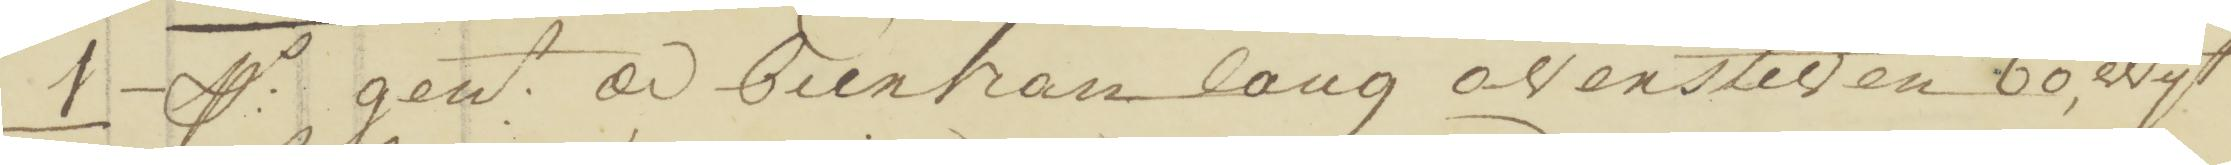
1 - p:s gen:t de bierkan lang oversteven 60, wyt
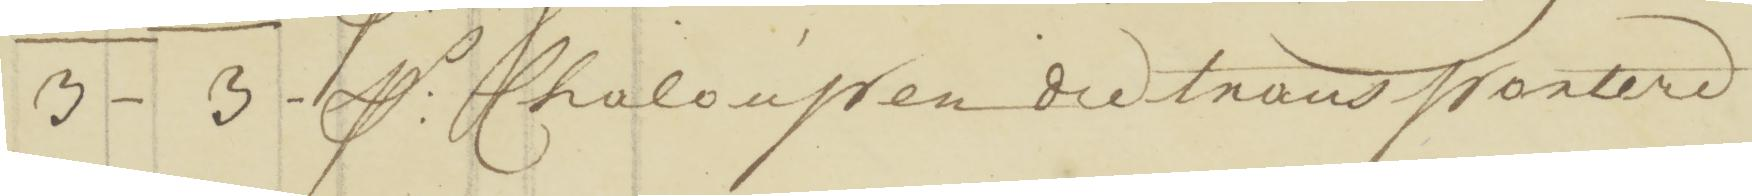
3 - 3 - p:s Chaloupen die transportere
